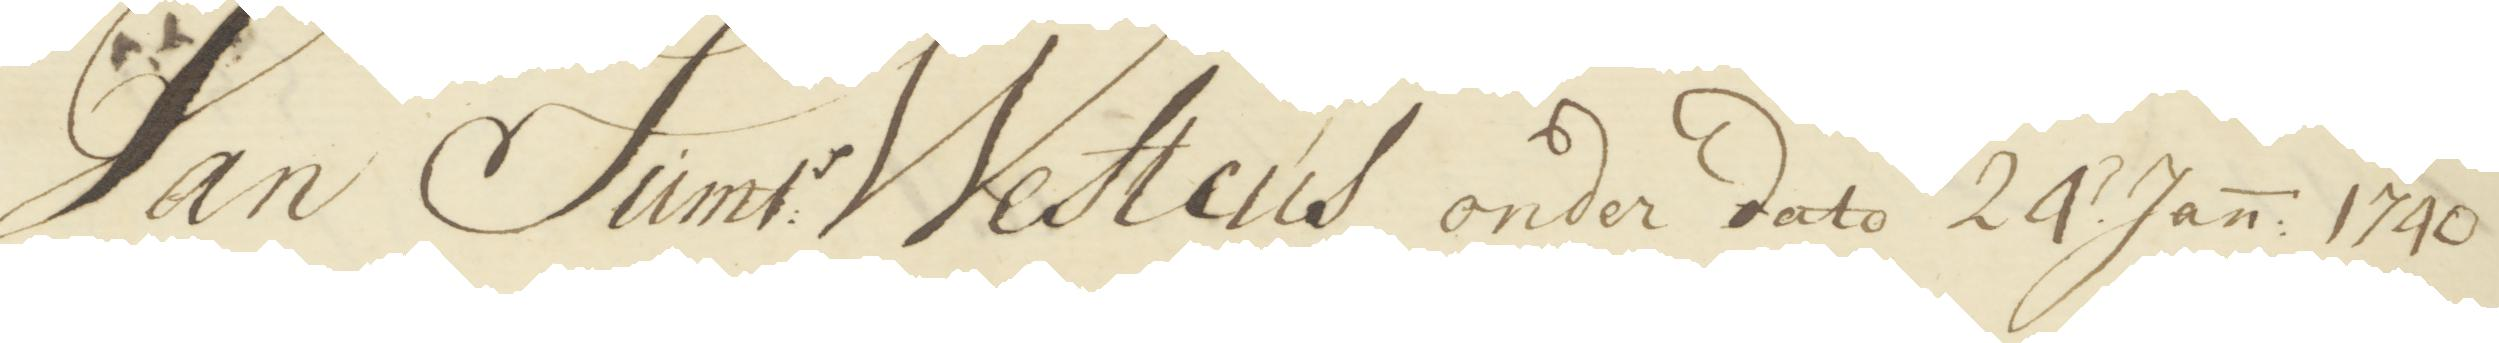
Van Sumt:s Westcus onder dato 24:' Jan: 1740
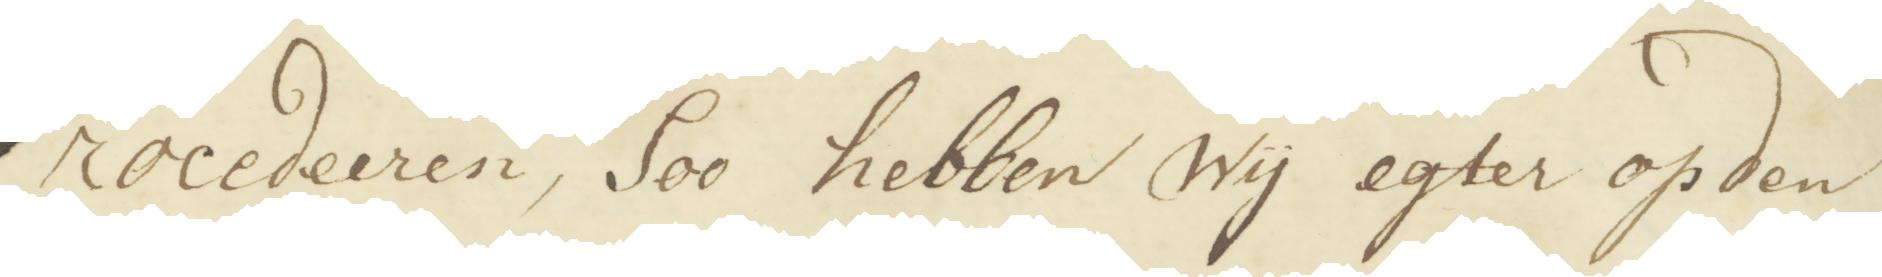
Procedeeren, soo hebben wij egter op den
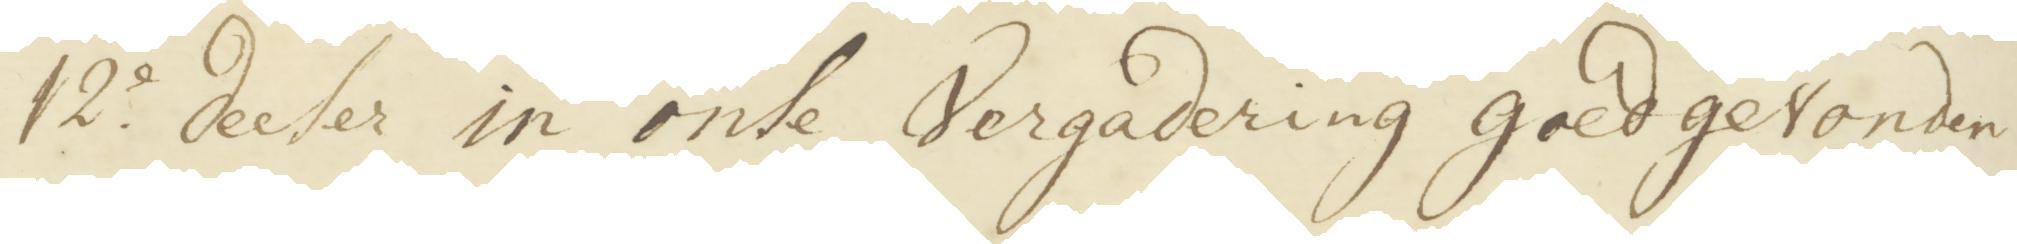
12:e deeser in onse Vergadering goed gevonden
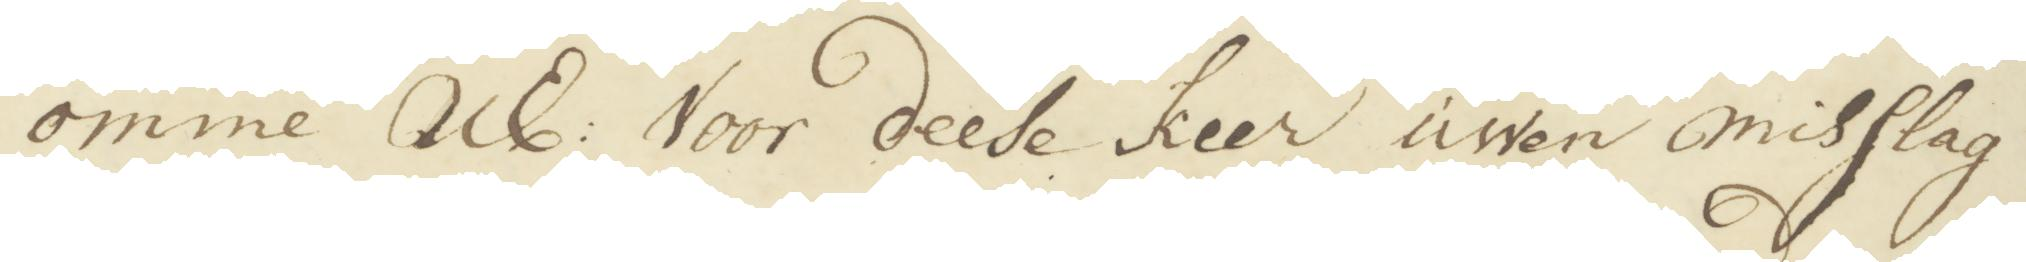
omme UE: voor deese keer uwen misslag
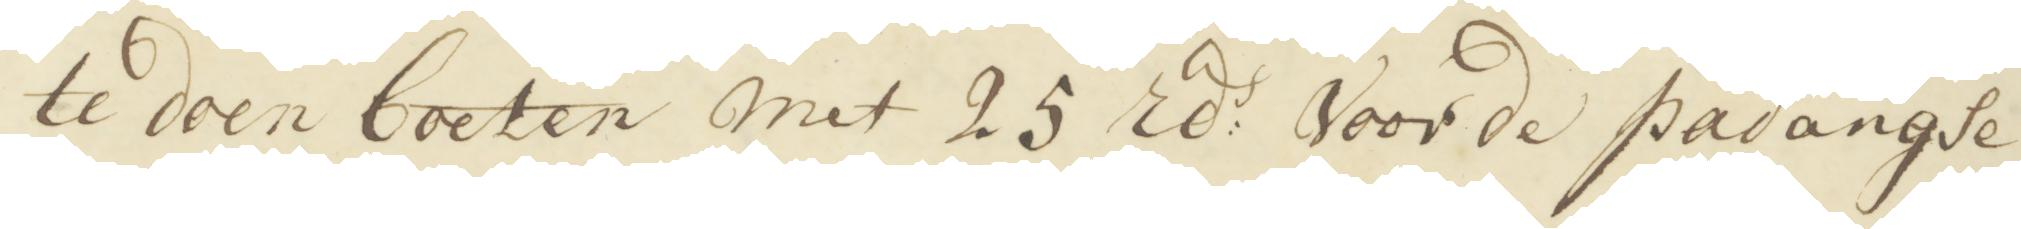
te doen boeten met 25 rd:s voor de padangse
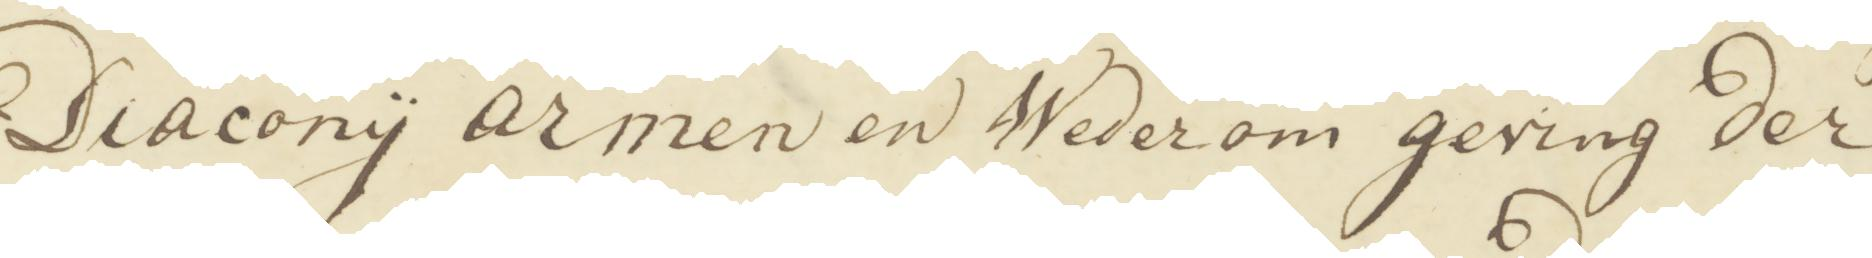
Diaconij armen en wederom geving der
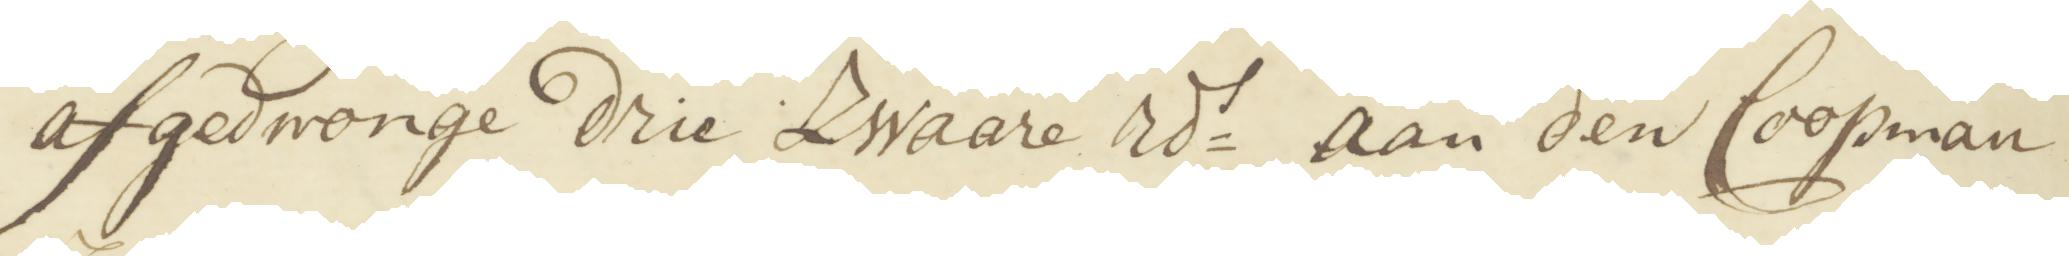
afgedwonge drie Zwaare rd:s aan den Coopman
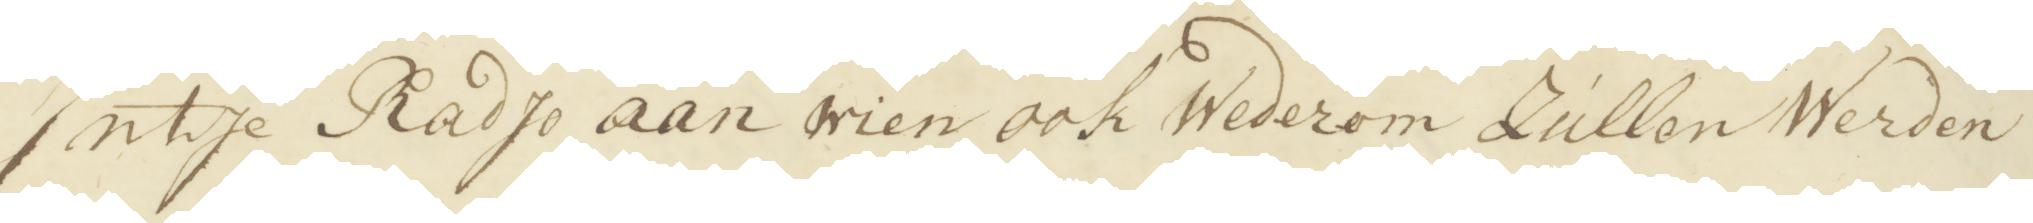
Jntje Radjo aan wien ook wederom Zullen werden
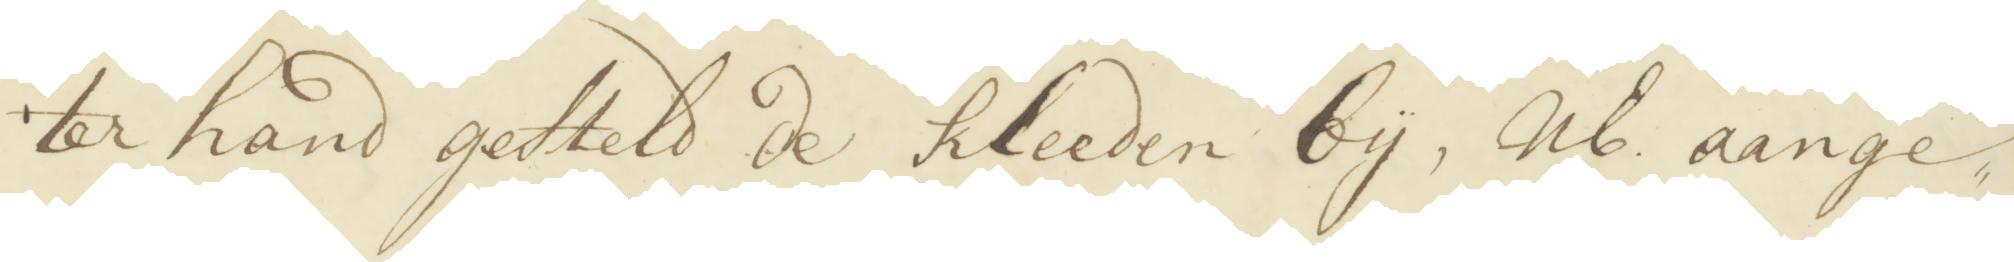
ter hand gesteld de kleeden bij, UE. aange„
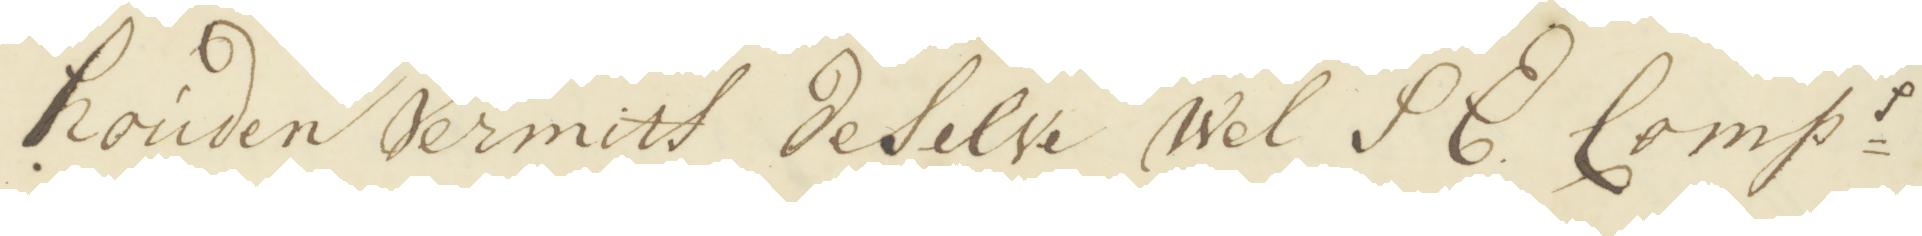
houden vermits deselve wel s E. Comp=s
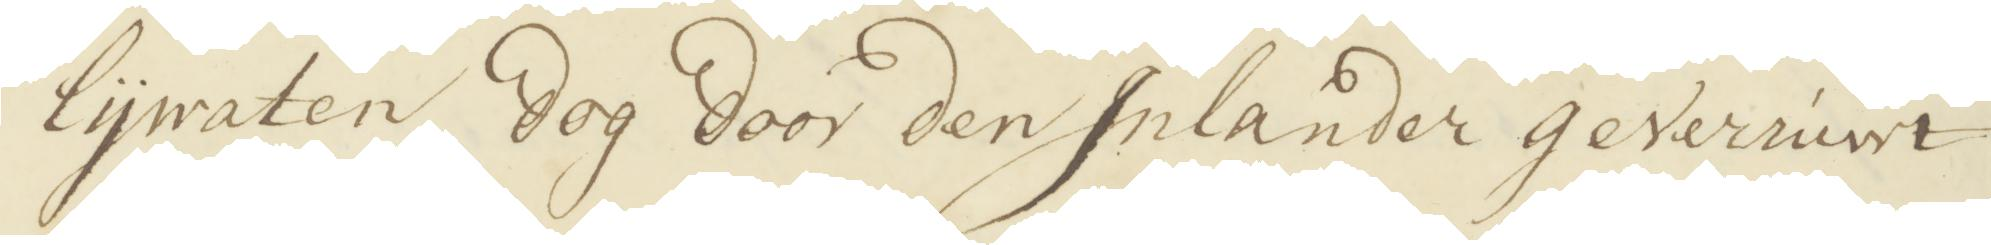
lijwaten, dog door den Jnlander geverruwt
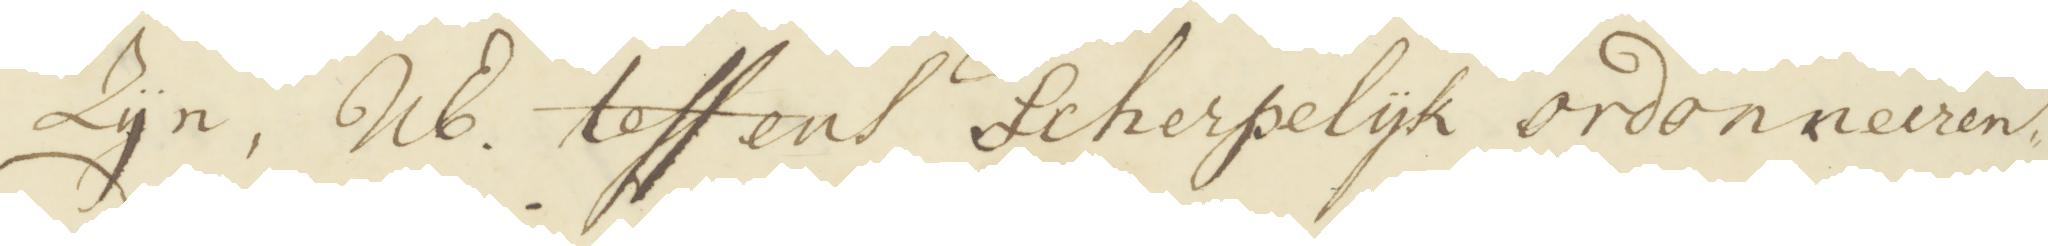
Zijn, UE. teffens scherpelijk ordonneeren
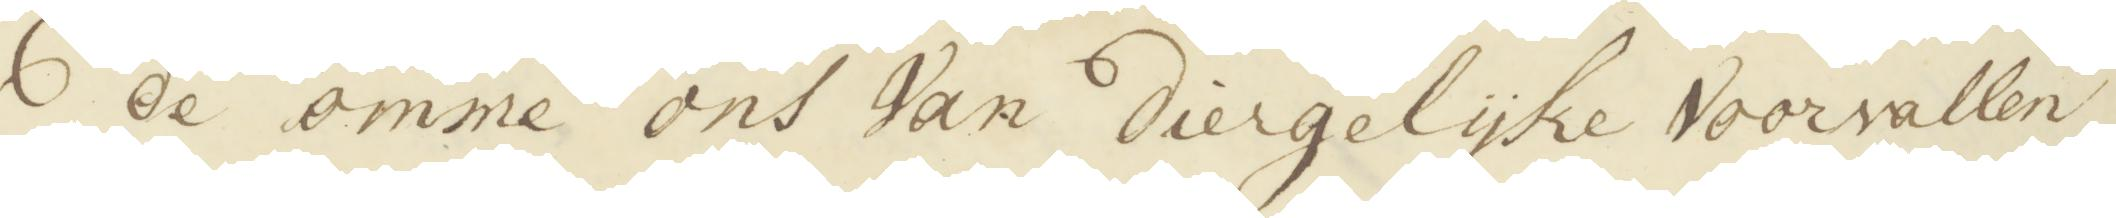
de omme ons van diergelijke voorvallen
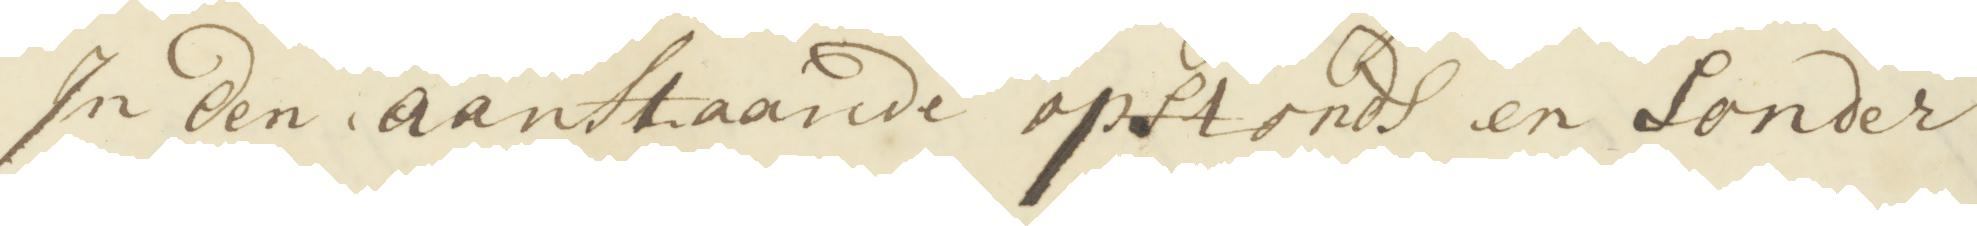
Jn den aanstaande opstonds en sonder
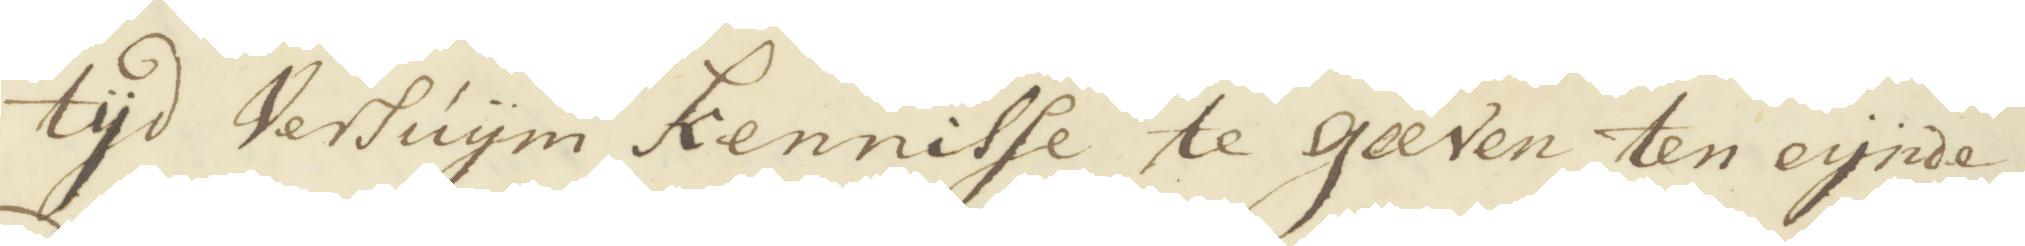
tijd versuijm kennisse te geeven ten eijnde
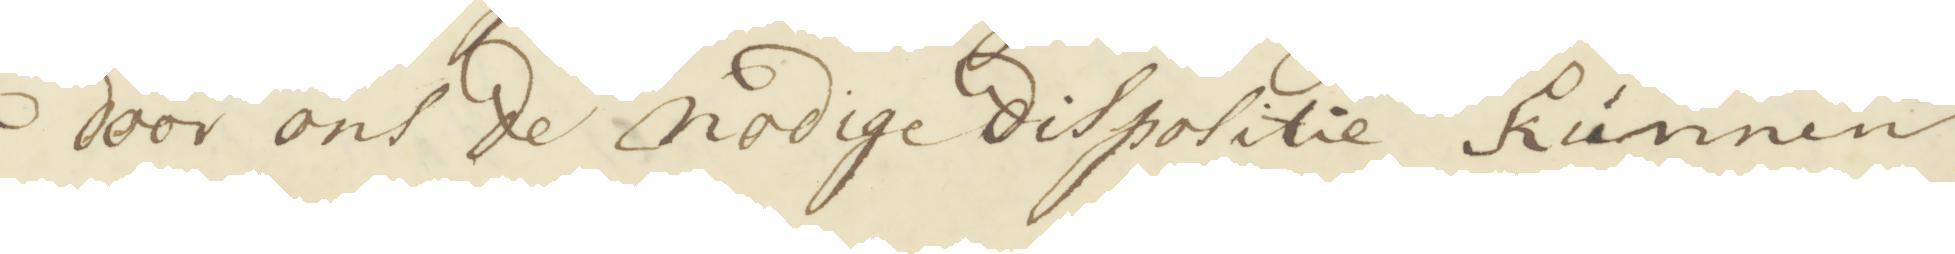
door ons de nodige dispositie kunnen
